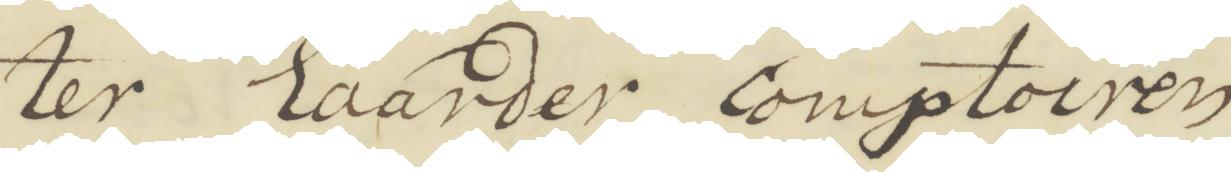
ter haarder comptoiren
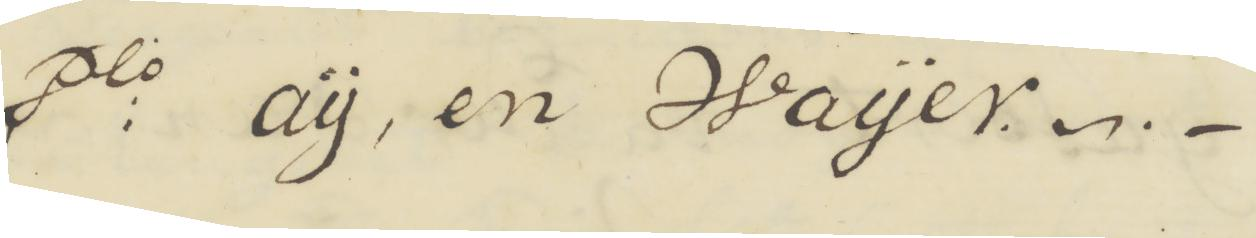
P:lo aij, en Waijer.~. -
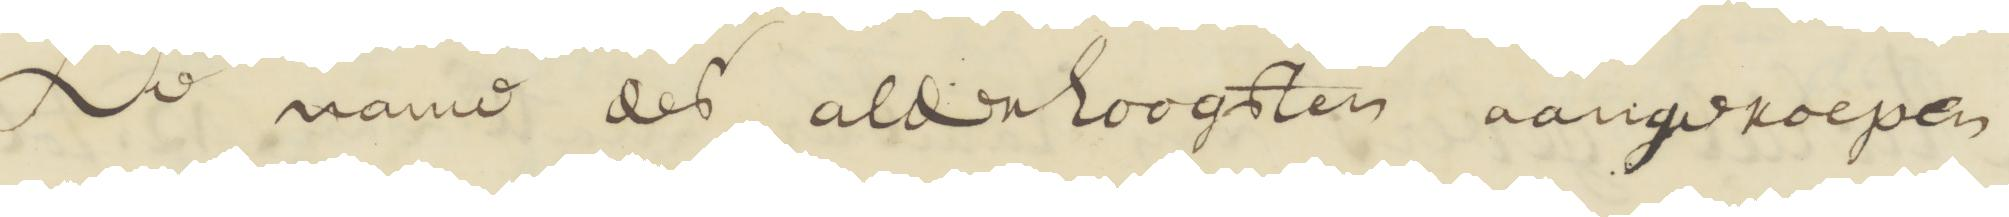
De name des alderhoogsten aangeroepen
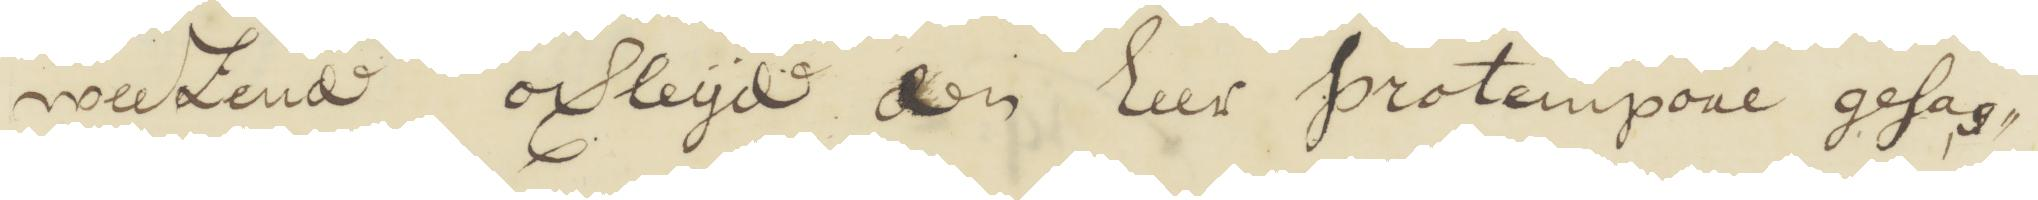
weezende overleijde den heer protempore gesag„
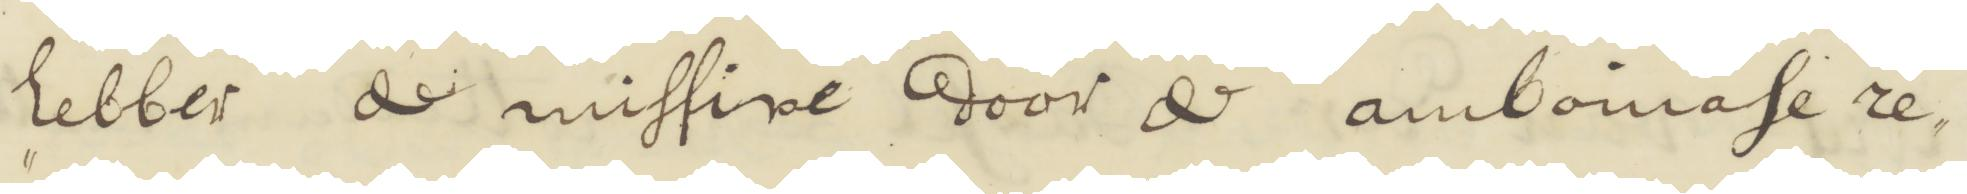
„hebber de missive door de amboinase re„
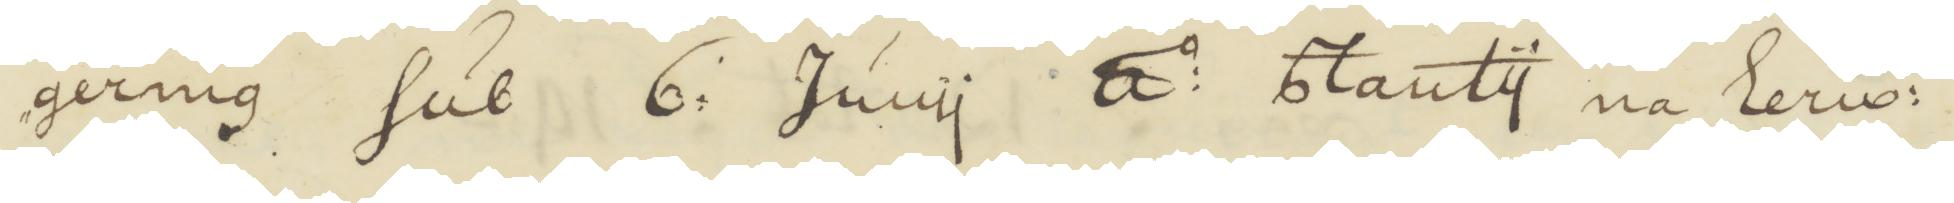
„gering sub 6: Junij a:o stantij na herw:s
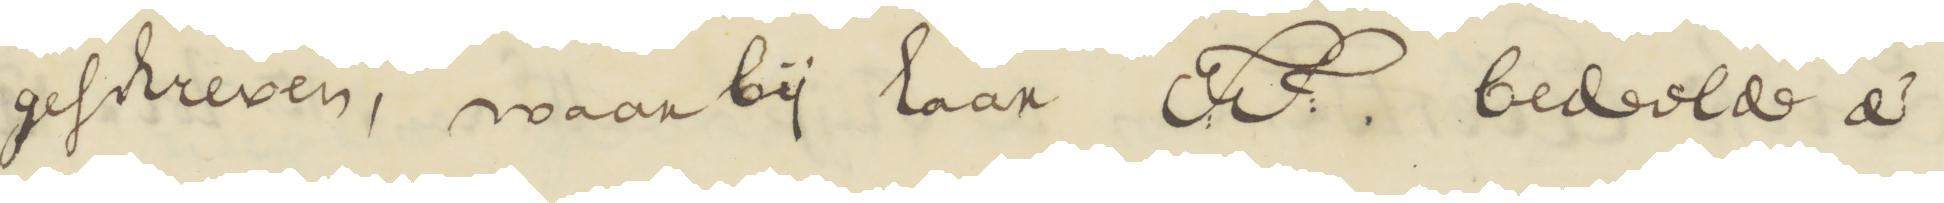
geschreven, waar bij haar E:E: bedeelde de
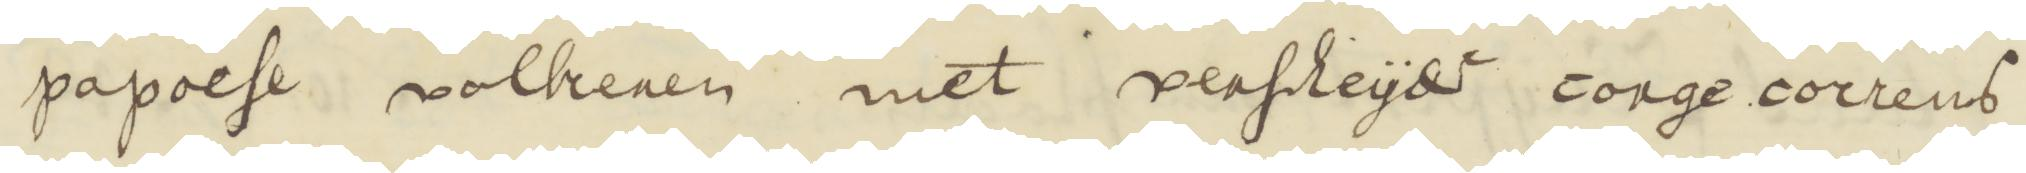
papoese volkeren met verscheijde corge correns
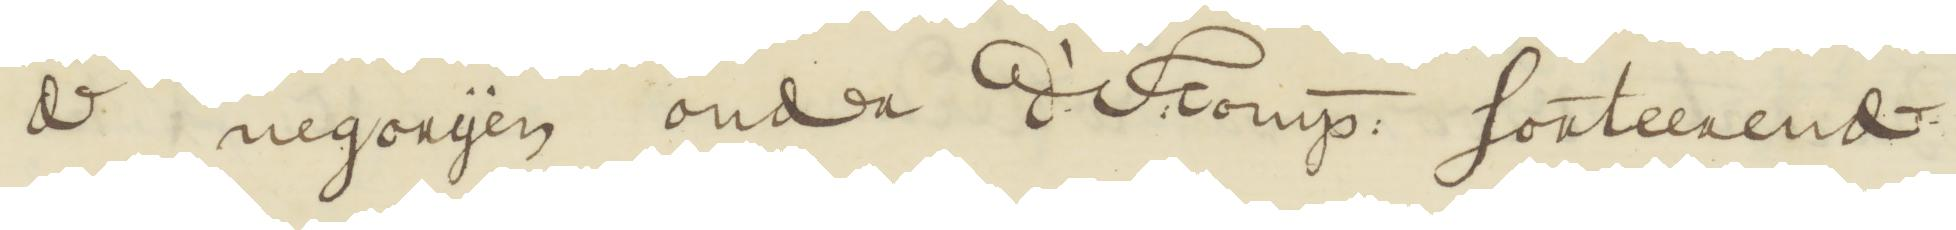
de negorijen onder d’E:comp: sorteerende
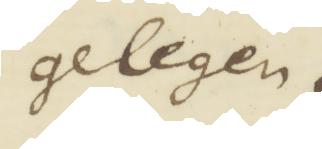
gelegen
